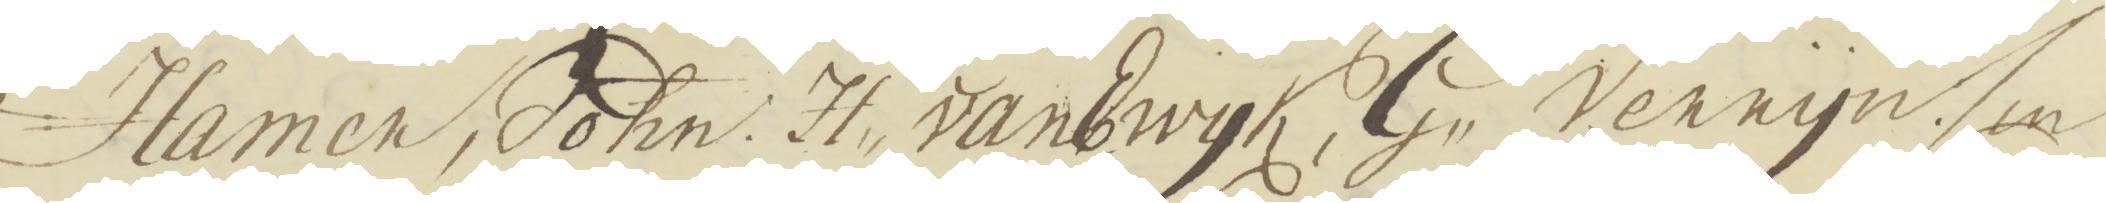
Hamer, Iohn: H„K van Ewijk, G„t Verrijn :/ in
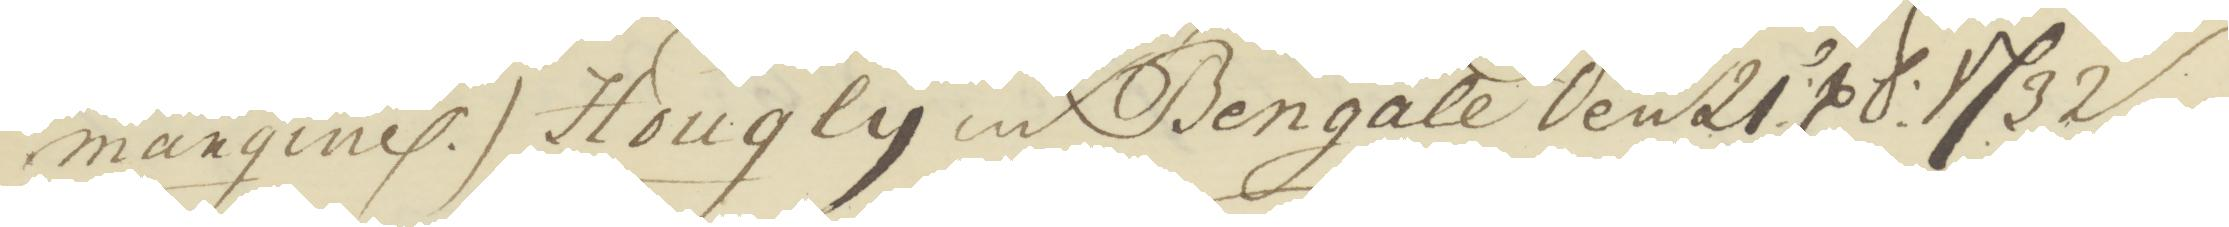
margine. / Houglij in Bengale den 21:' xb: 1732.
